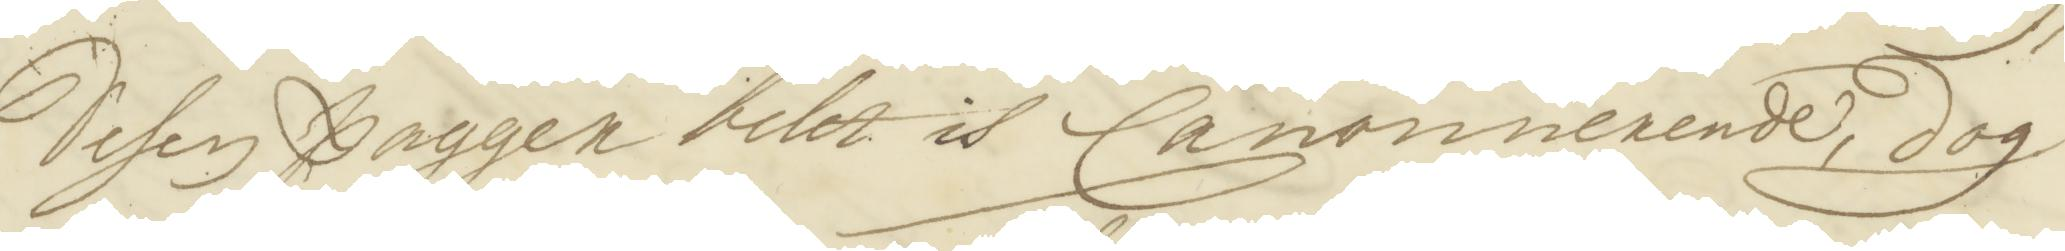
desen pagger belet is Canonnerende, dog
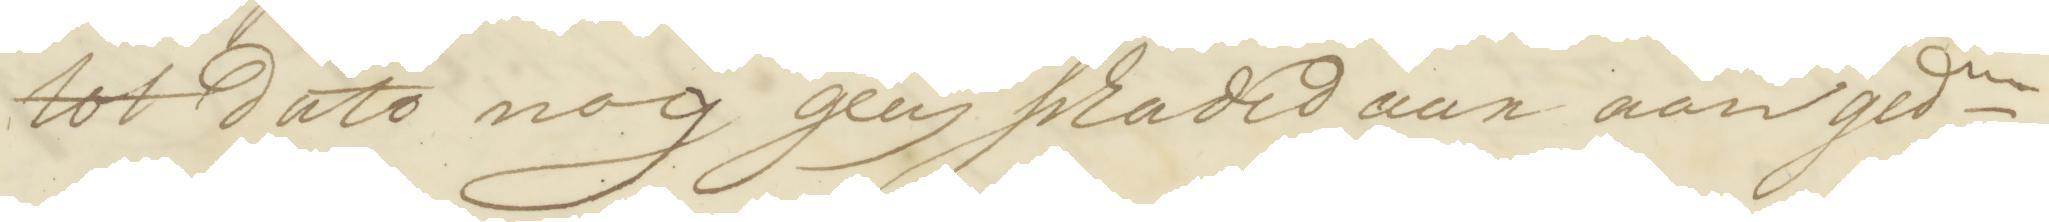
tot dato nog geen schade daar aan ged=m
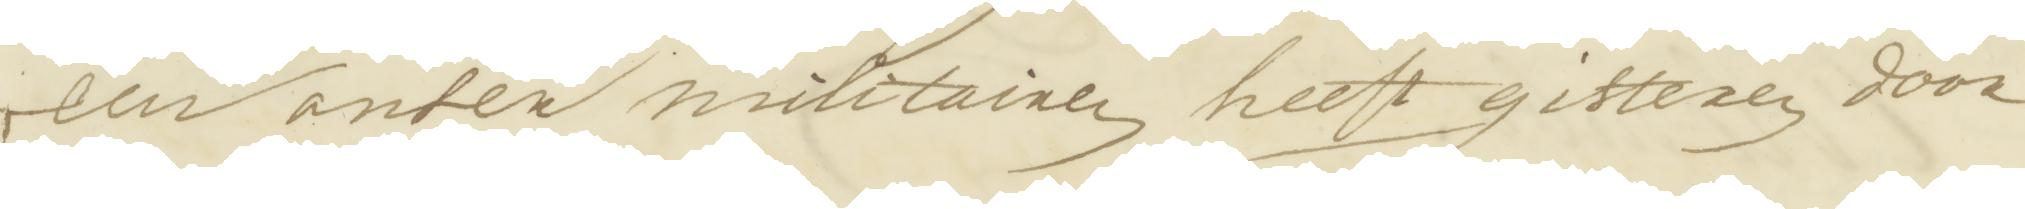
een onser militairen heeft gisteren door
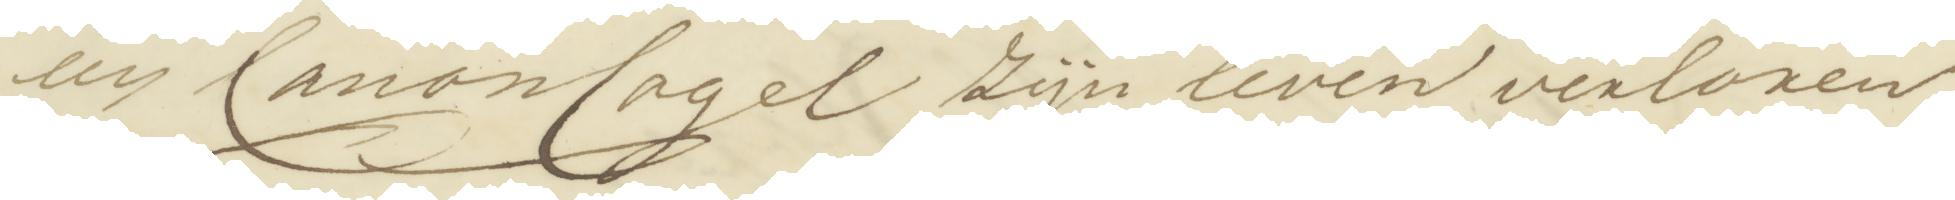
een Canoncogel zijn leven verloren,
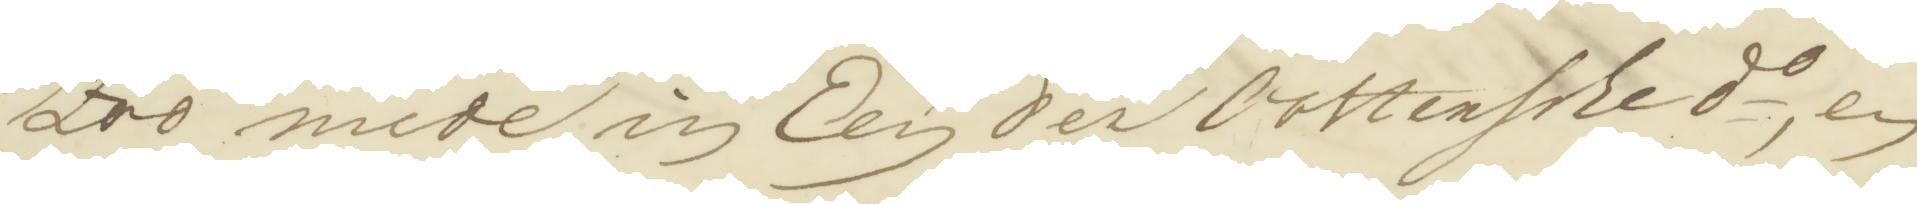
zoo mede in Een der Oostersche d=o, en
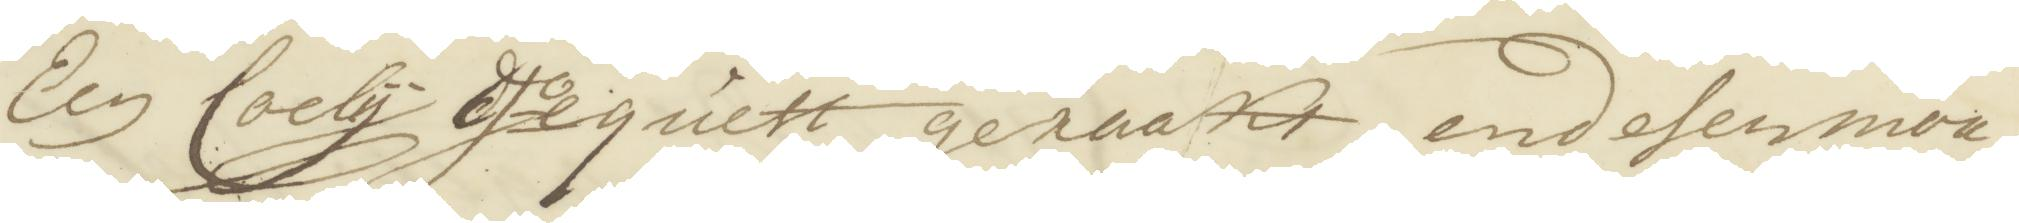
Een Coelij g=e equest geraakt, en desen mor
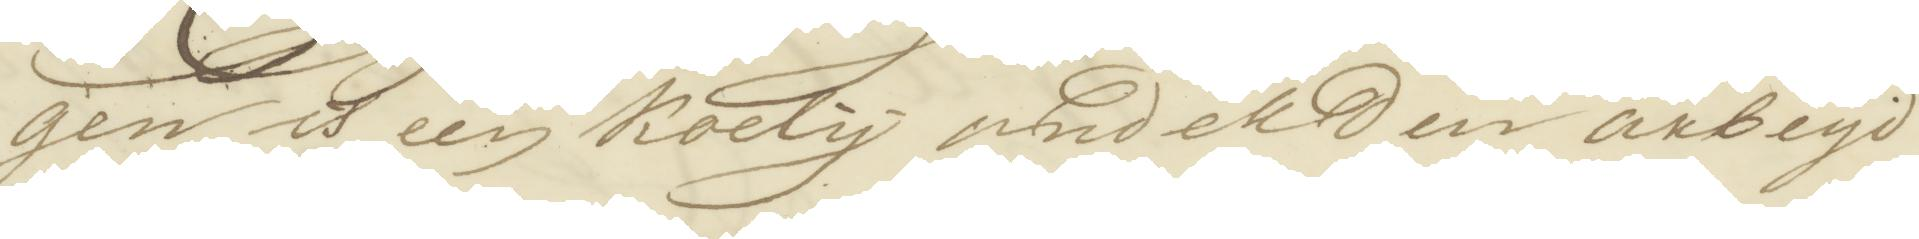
gen is een koelij onder den arbeijd
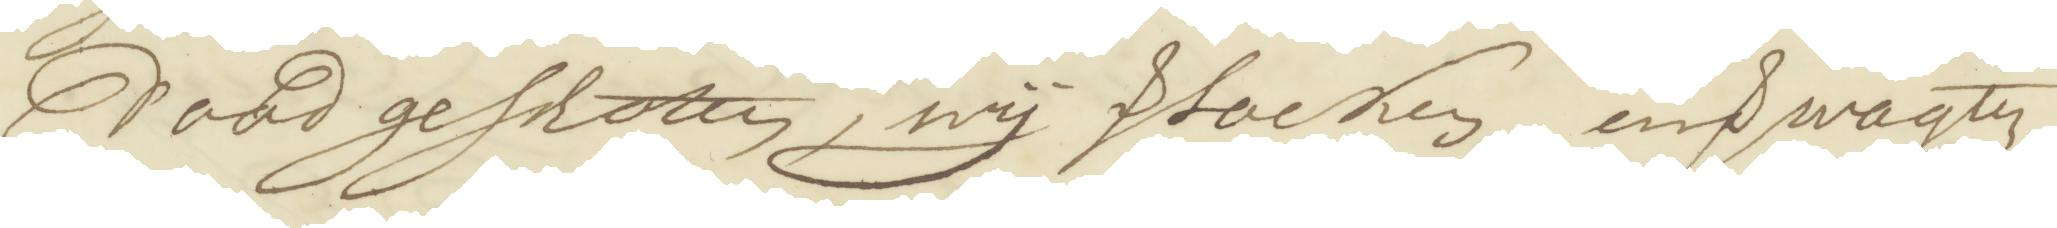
dood geschoten, wij versoeken, en verwagten
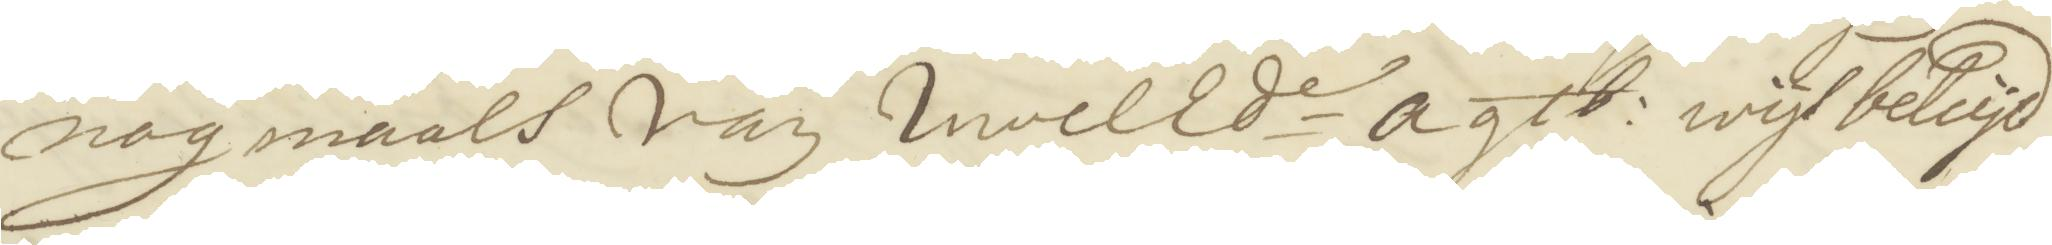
nog maals van uwel Ed=e agtb: wijs beleijd
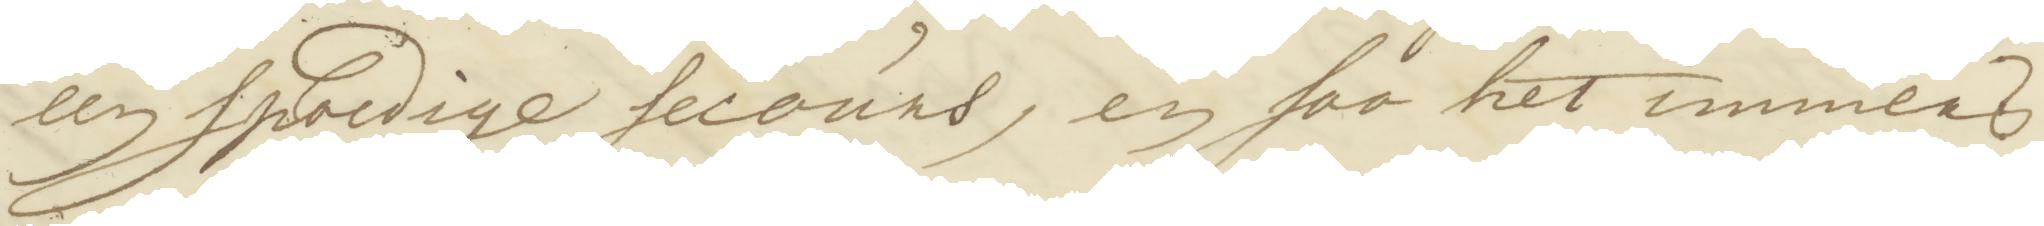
een spoedige secours, en soo het immer
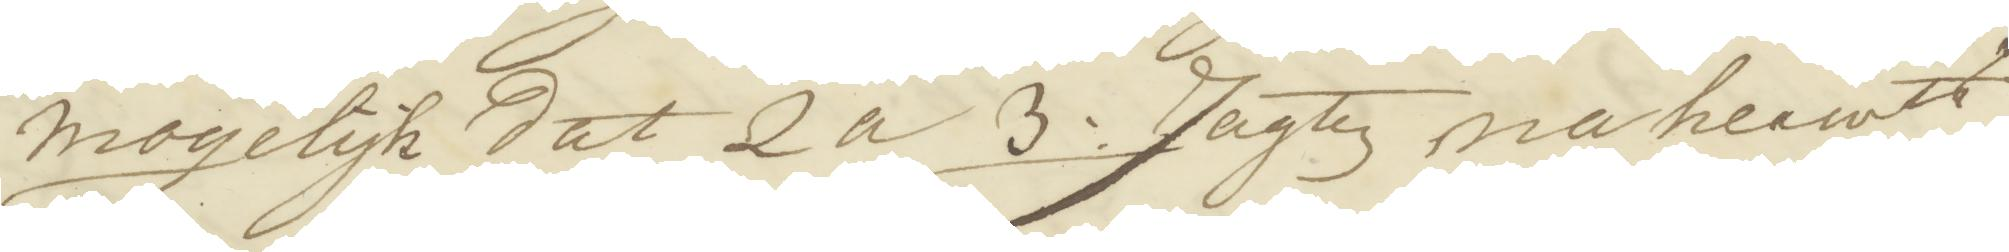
mogelijk dat 2 a 3: Jagten na herw=ts
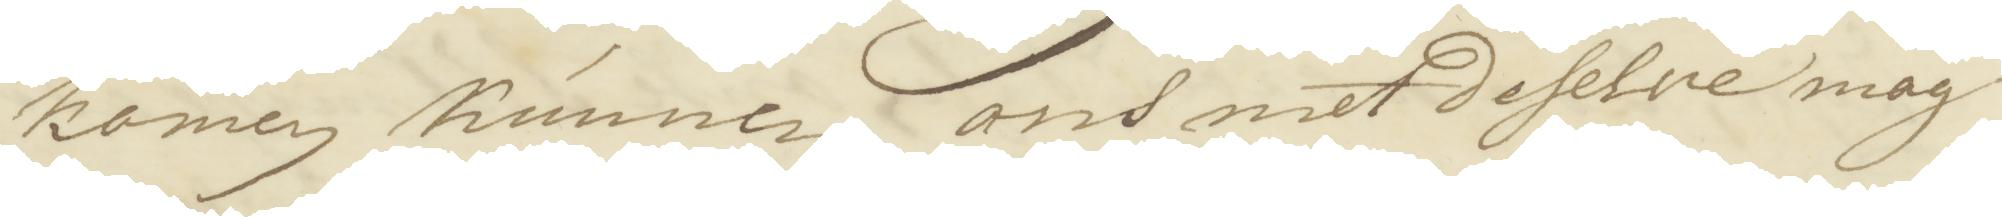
komen kunnen ons met deselve mag
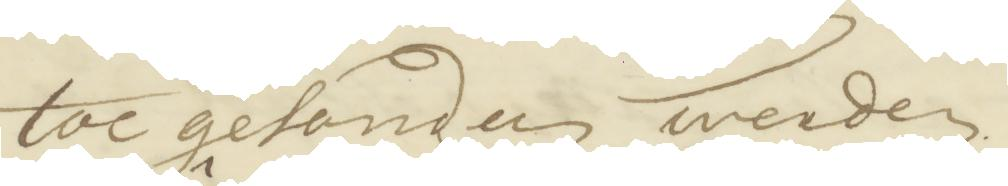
toe gesonden werden
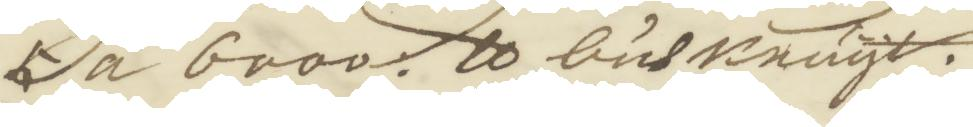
5 â 6000: lb buskruijt.
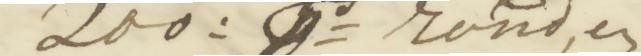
200: p=s rond, en
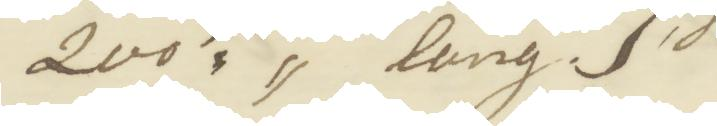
200: „ lang.
